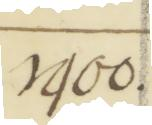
1400.
